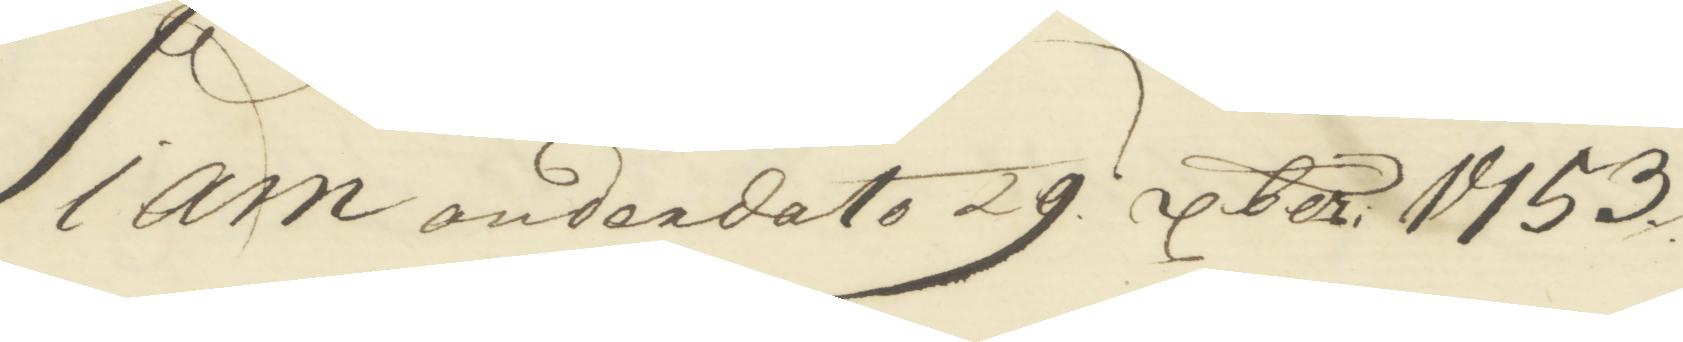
Van Siam onderdato 29.' xber: 1753.
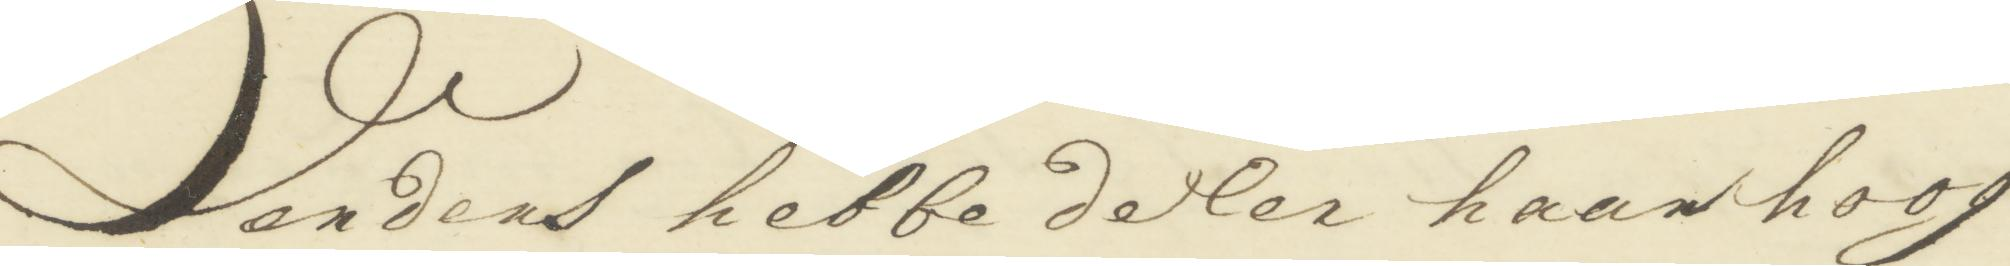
Verders hebbe de Eer haar hoog
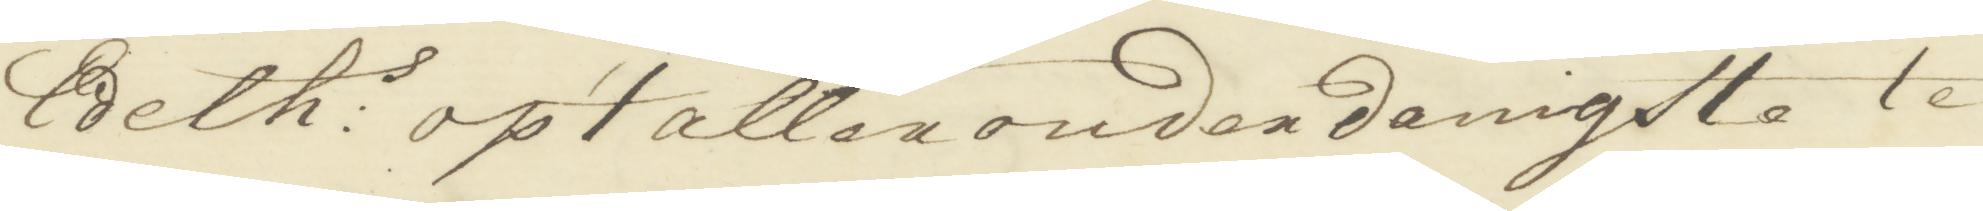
Edelh:s op ’t aller onderdanigste te
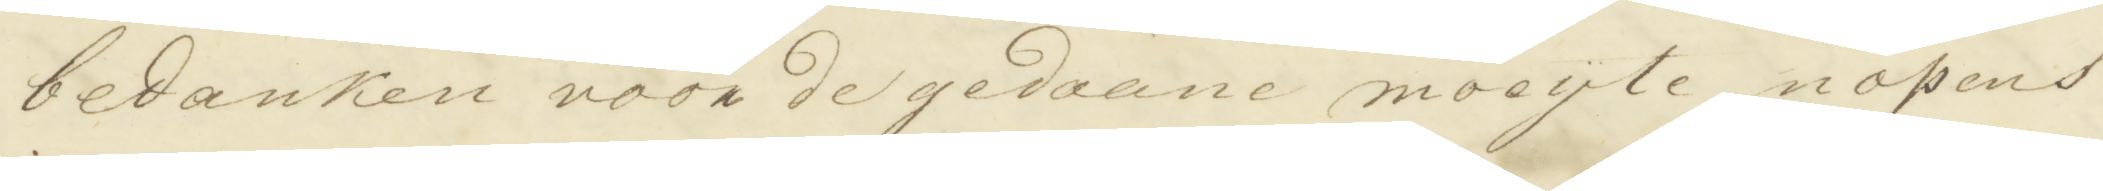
bedanken voor de gedaane moeijte nopens
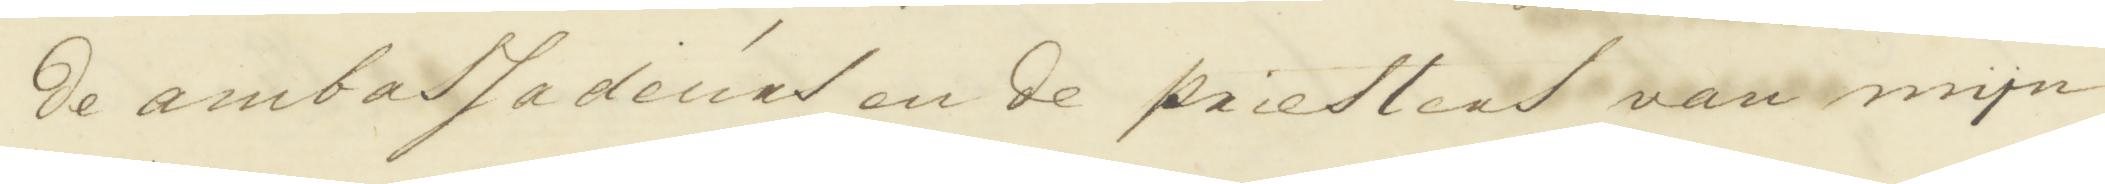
de ambassadeurs en de priesters van mijn
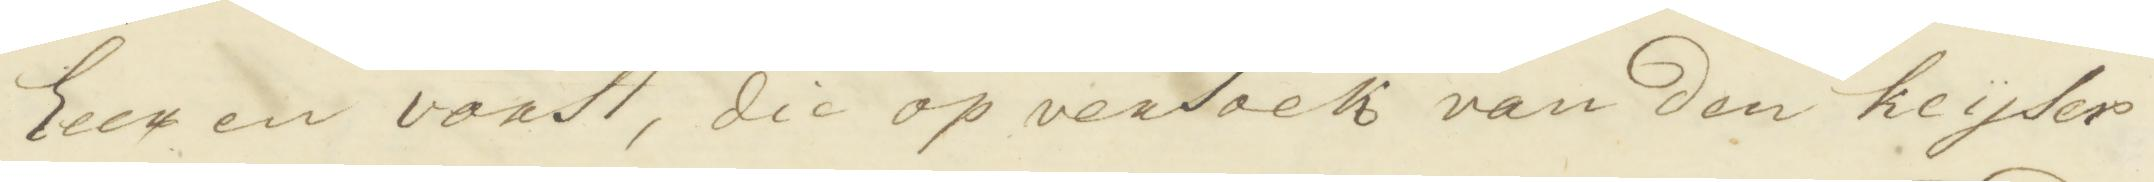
heer en vorst, die op versoek van den keijser
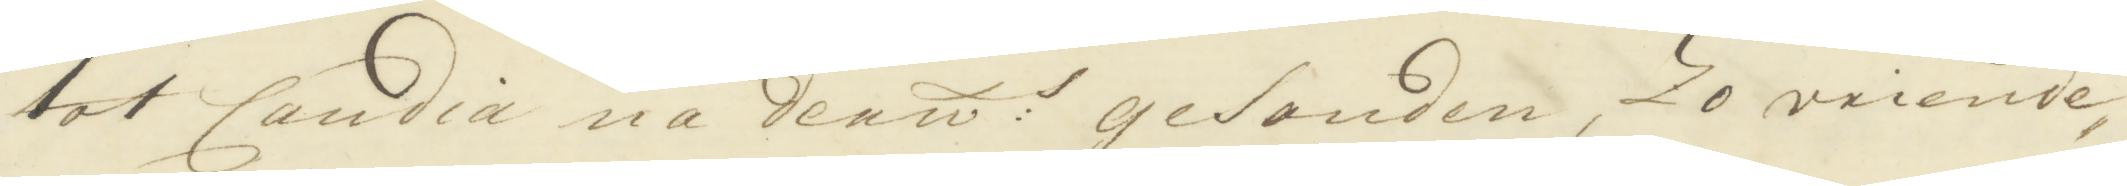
tot Candia na derw:s gesonden, zo vriende„
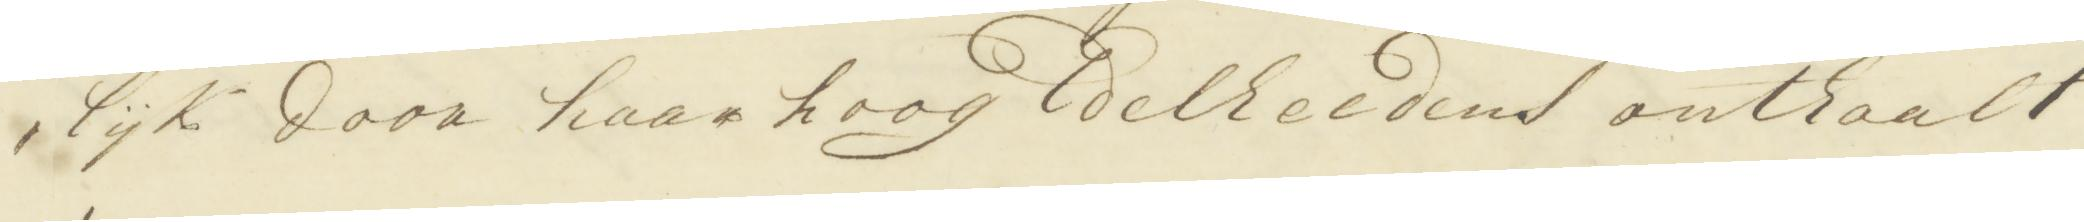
„lijk door haar hoog Edelheedens onthaalt
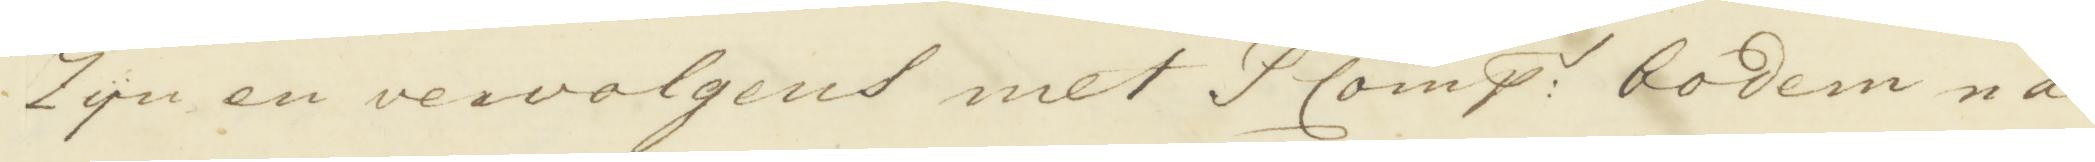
zijn en vervolgens met ’s Comp:s bodem na
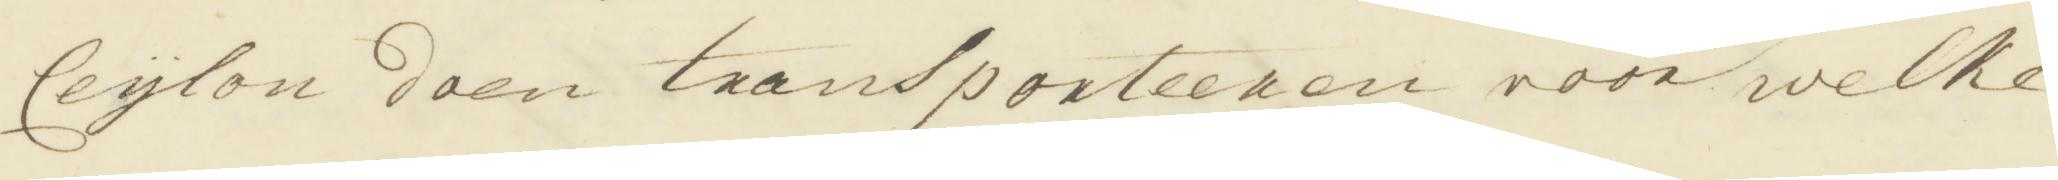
Ceijlon doen transporteeren voor welke
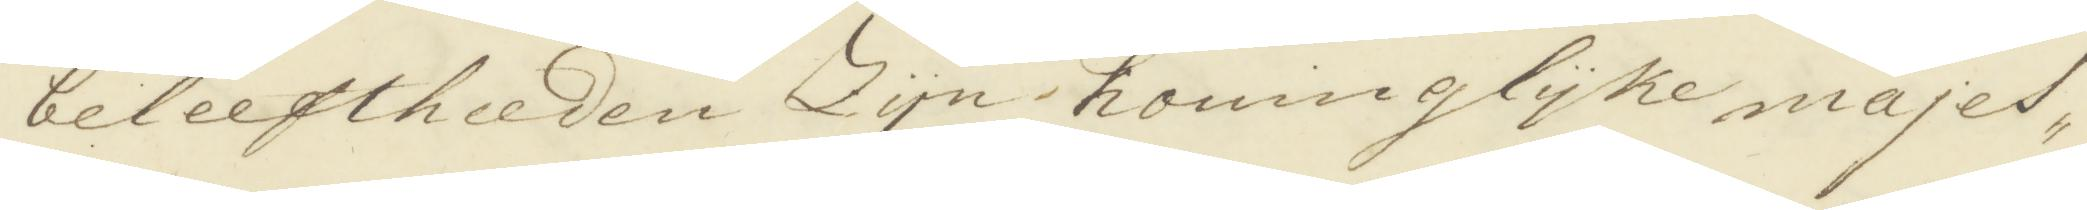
beleeftheeden zijn koninglijke majes„
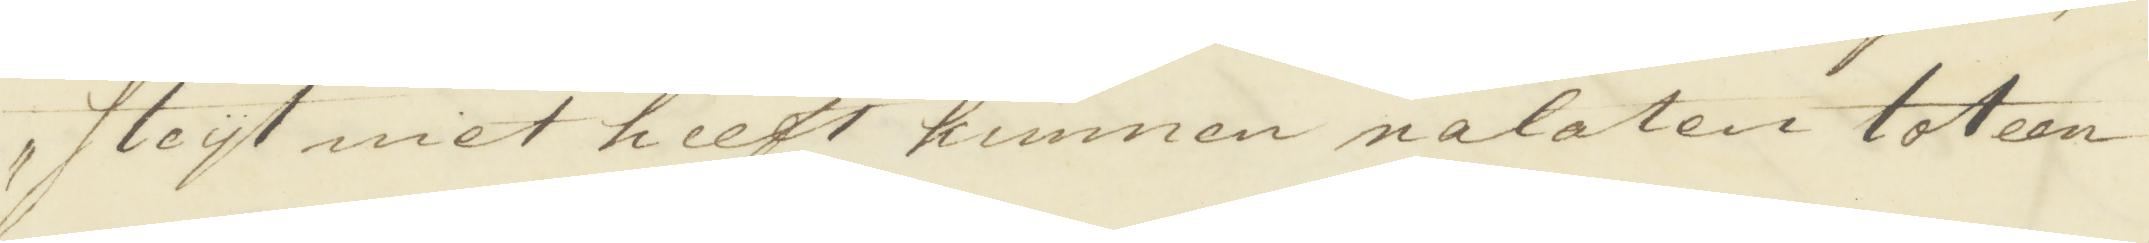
„steijt niet heeft kunnen nalaten tot een
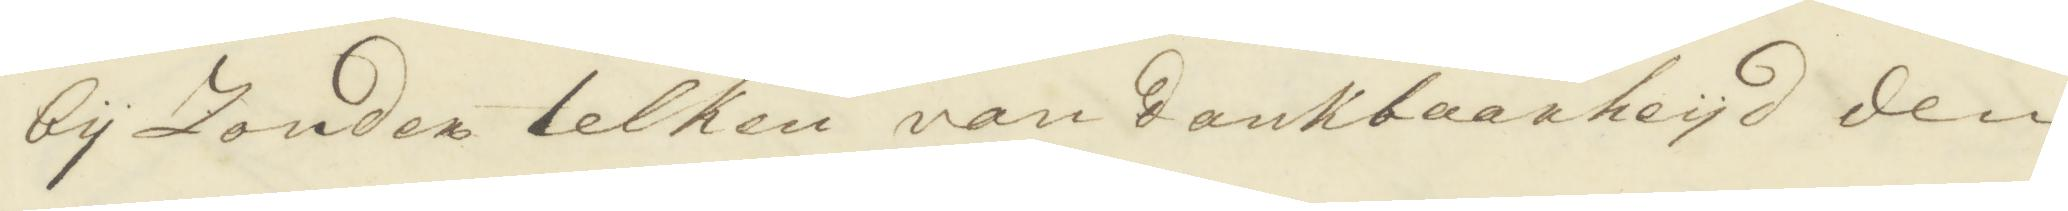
bij zonder telken van dankbaarheijd den
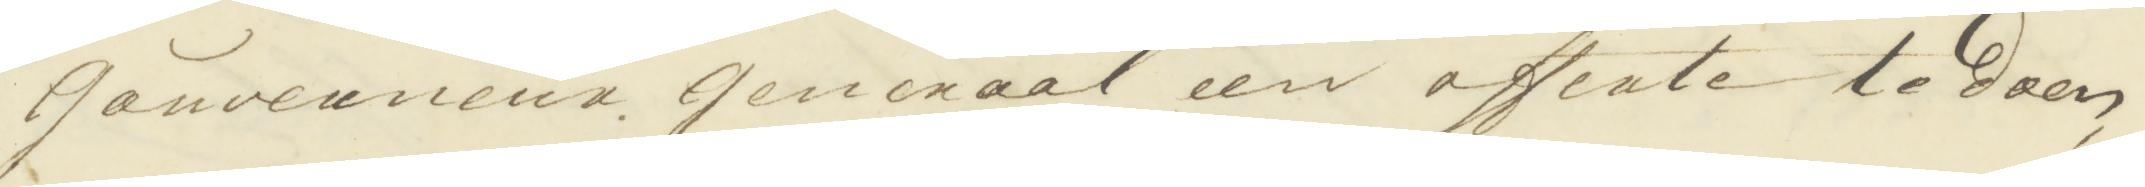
Gouverneur generaal een offerte te doen,
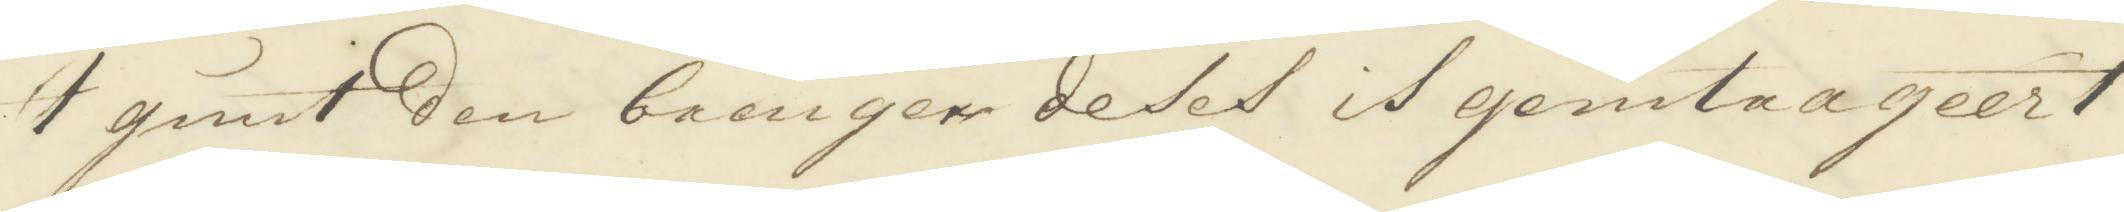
’t gunt den brenger deses is geintrageert
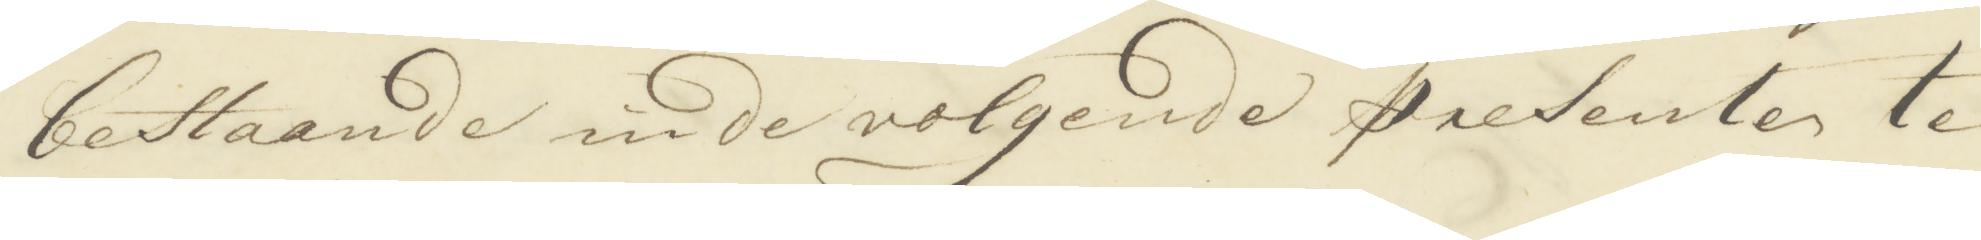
bestaande in de volgende presenten te
